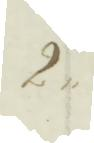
„ 2„
